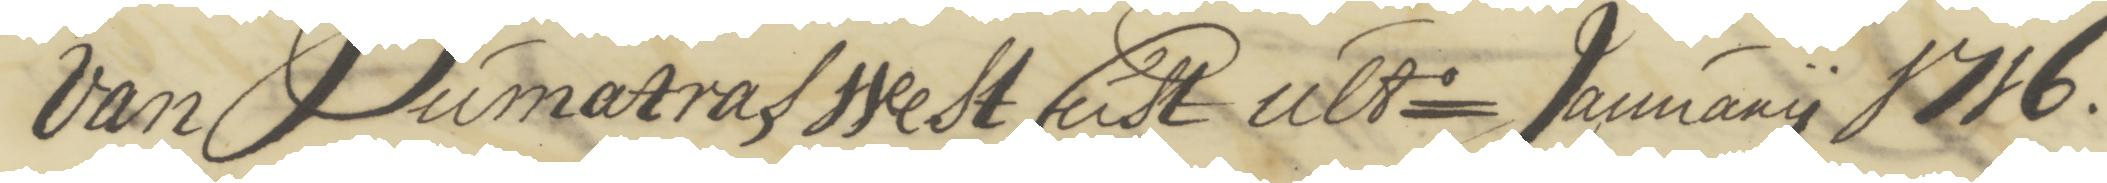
Van Sumatras West Cust ult=o Januarij 1716.
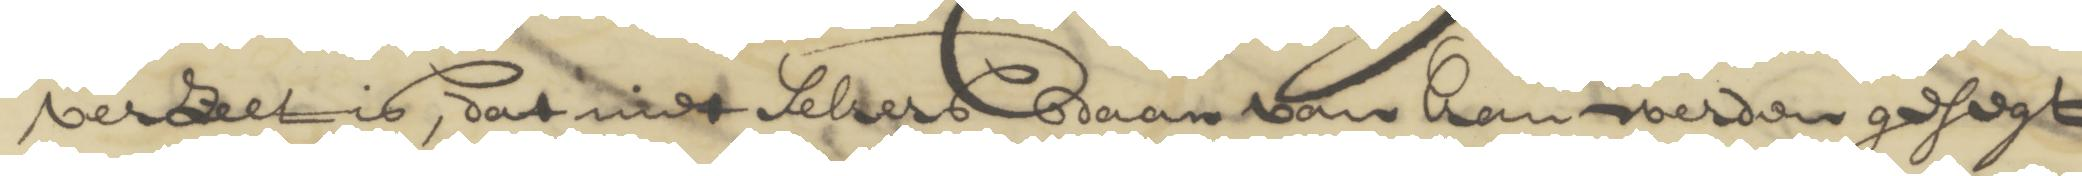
verzelt is, dat niet selvers daar van kan werden gesegt
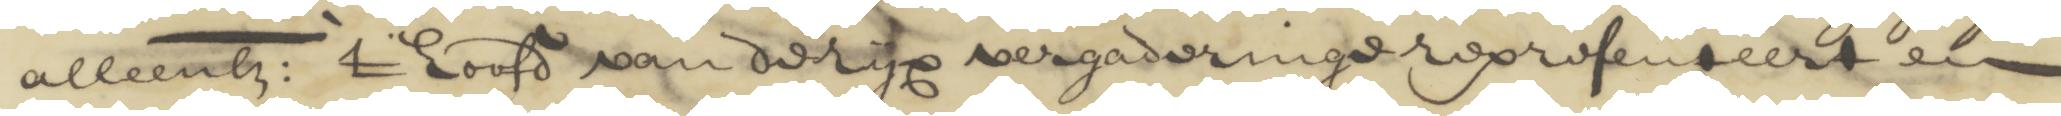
alleenlijk ’t hoofd van de rijx vergaderinge representeert en
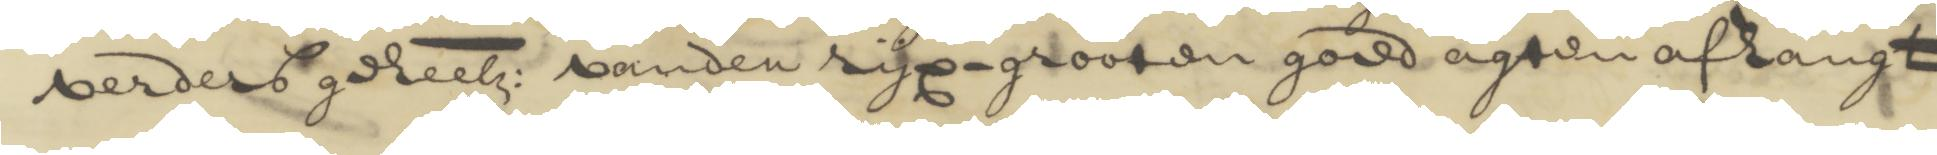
verders geheelijk van den rijx-grooten goed agten afhangt.
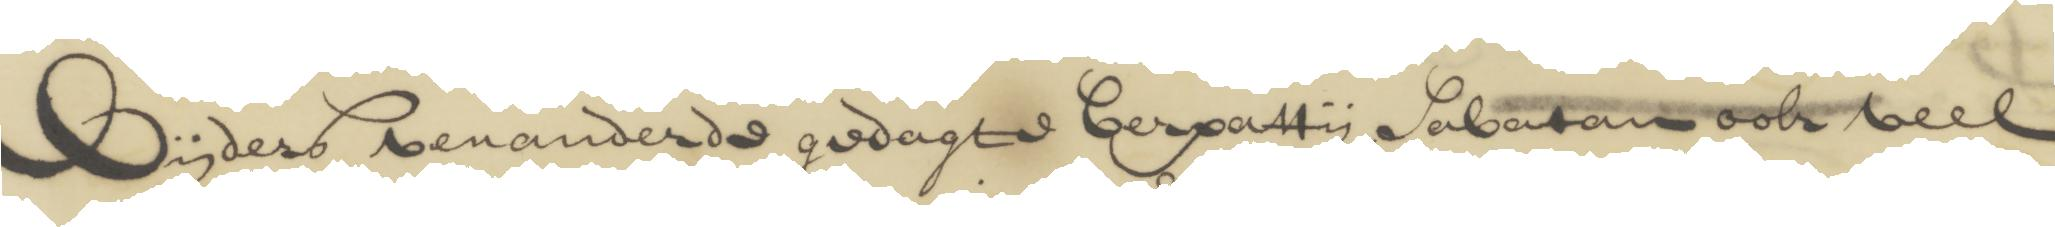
Wijders veranderde gedagte berpattij Sabatan ook veel
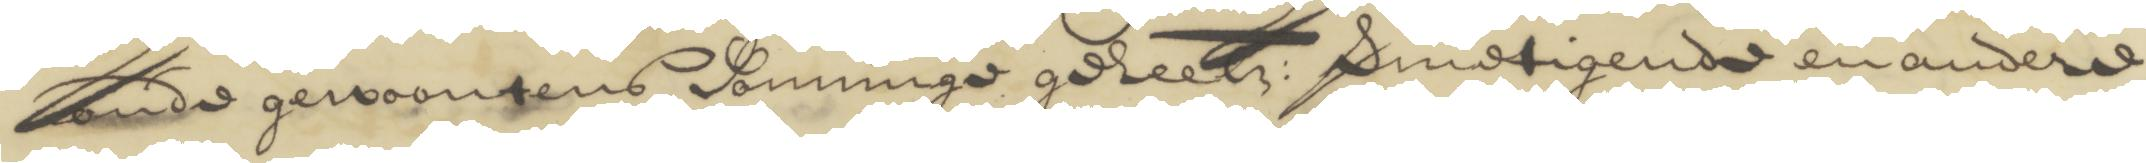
oude gewoontens sommige geheelijk vernietigende en andere
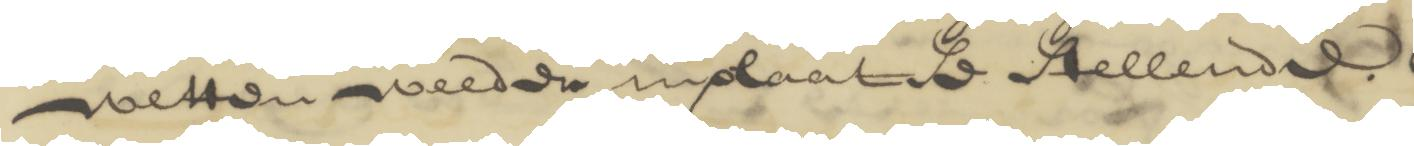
wetten weeder inplaatse stellende.
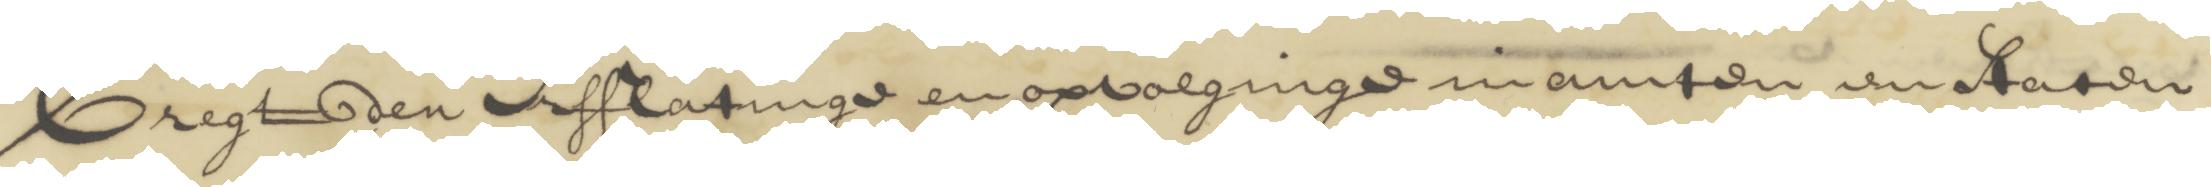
'T regt der Erfflatinge en opvolginge in amten en staten
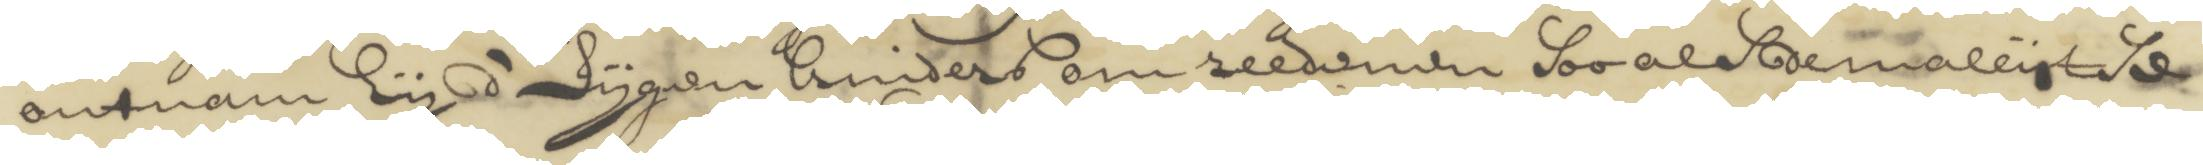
ontnam hij d' Eijgen kinders om reedenen soo als de maleijtse
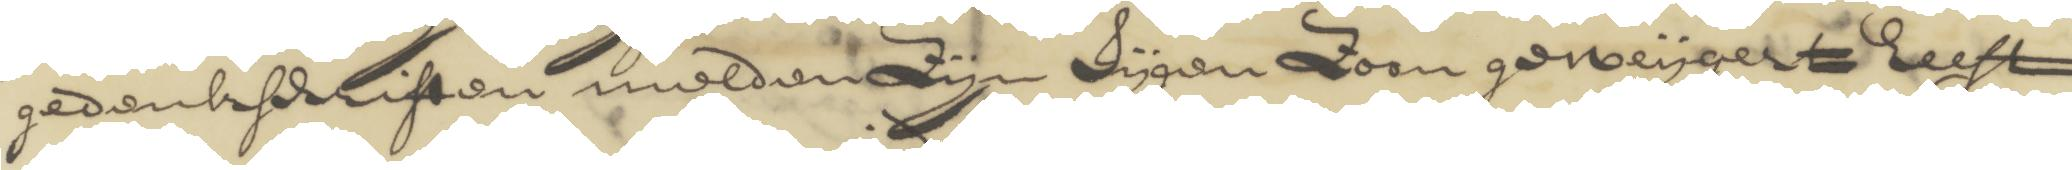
gedenkschriften melden zijn Eijgen zoon geweijgert heeft
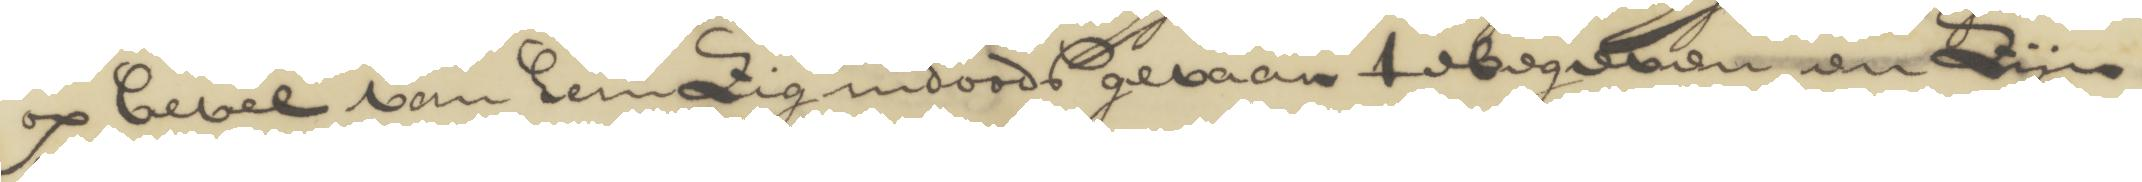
op bevel van hem zig in doods gevaar te begeven, en zijn
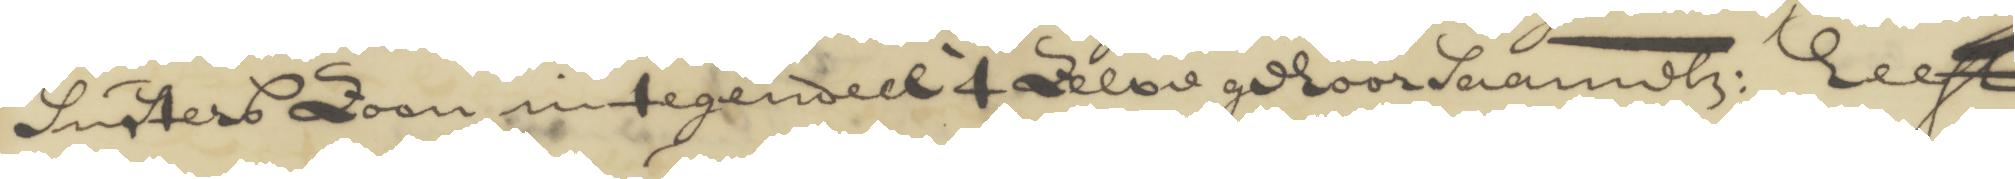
susters zoon in tegendeel ’t zelve gehoorsaamelijk heeft
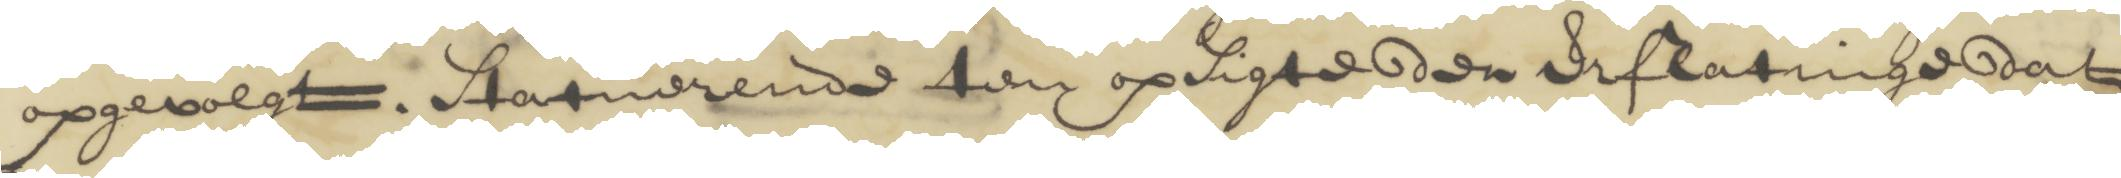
opgevolgt. Statuerende ten opsigte der Erflatinge dat
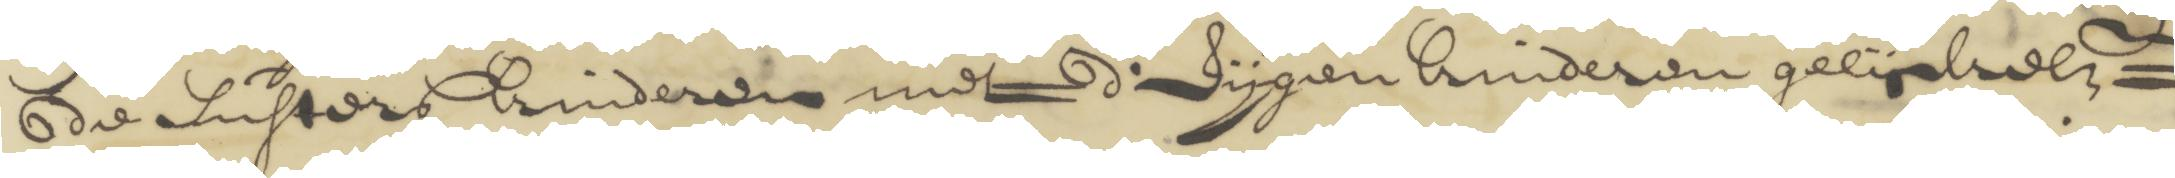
de susters kinderen met d’Eijgen kinderen gelijckelijk=
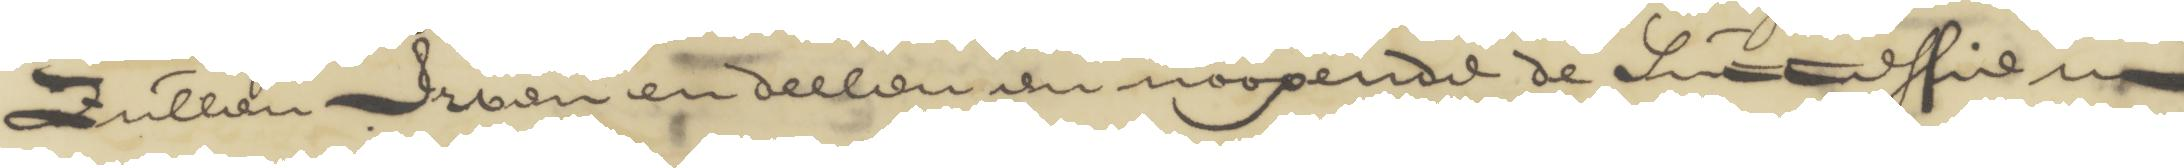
zullen Erven en deelen en noopende de successie in
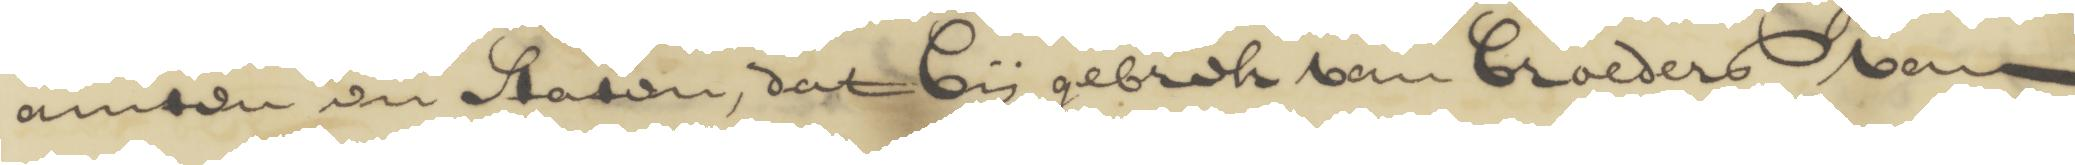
amten en staten, dat bij gebrek van broeders van
